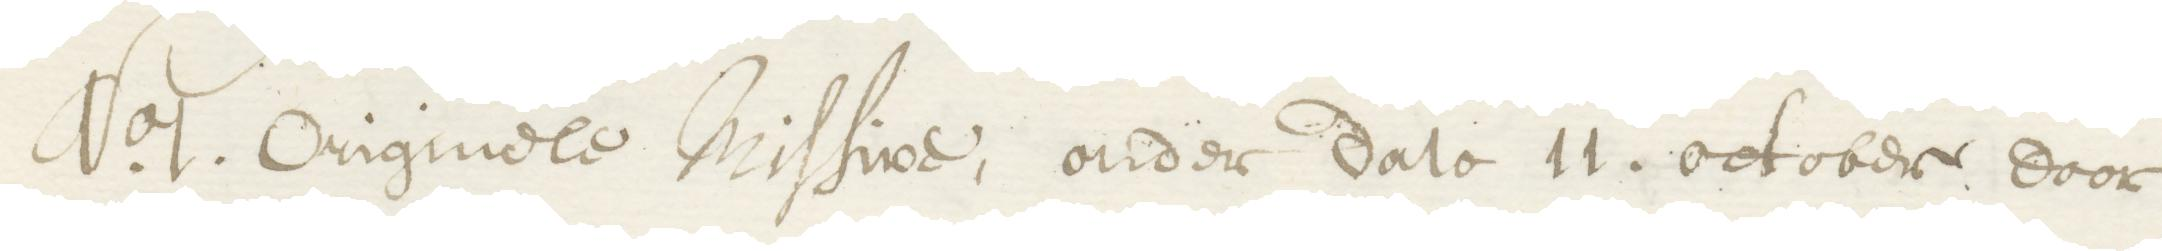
N.o 1. Originele Missive, onder dato 11.en october door
